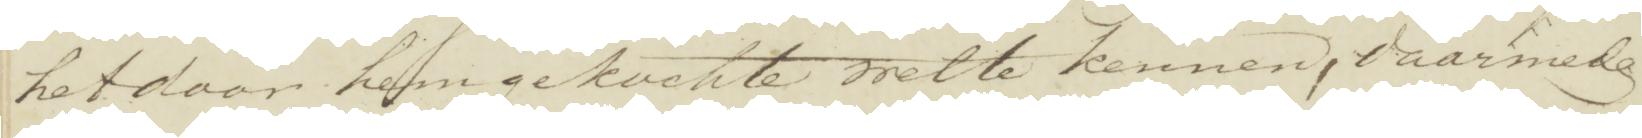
het door hem gekochte welte kennen, daarmede
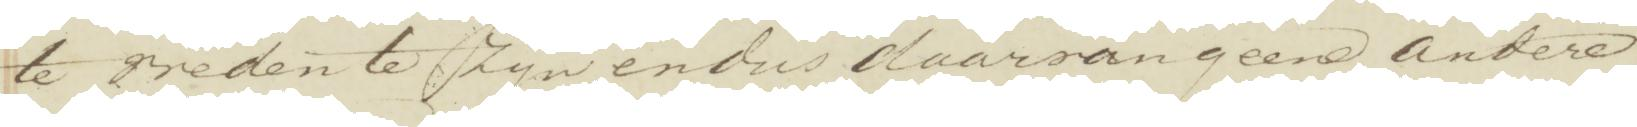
te vreden te zijn en dus daarvan geene andere
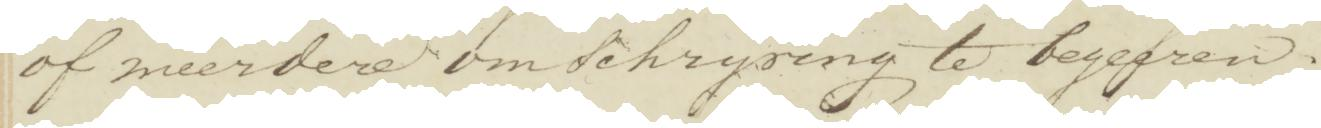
of meerdere omschrijving te begeeren
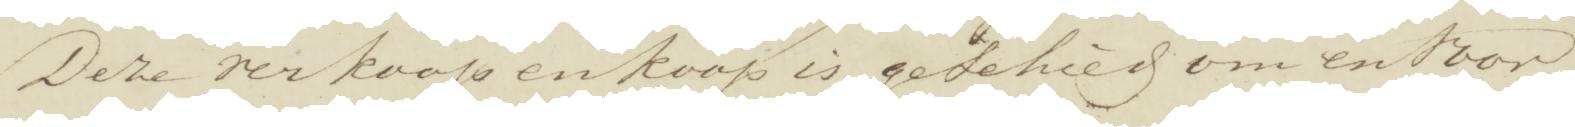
Deze verkoop en koop is geschied om en voor
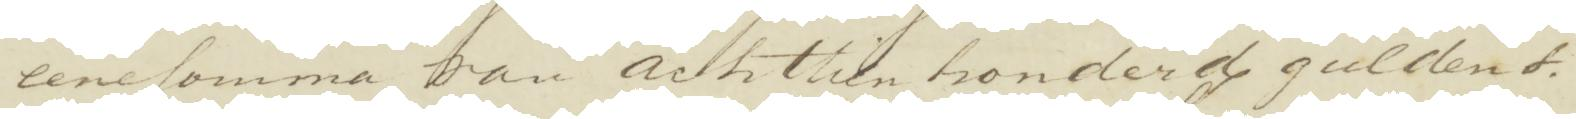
eene somma van achttien honderd guldens.
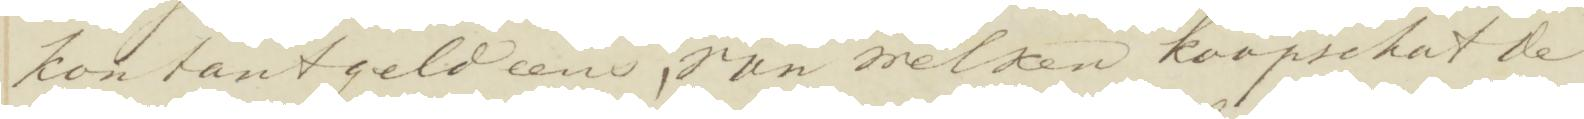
kontantgeld eens, van welken koopschat de
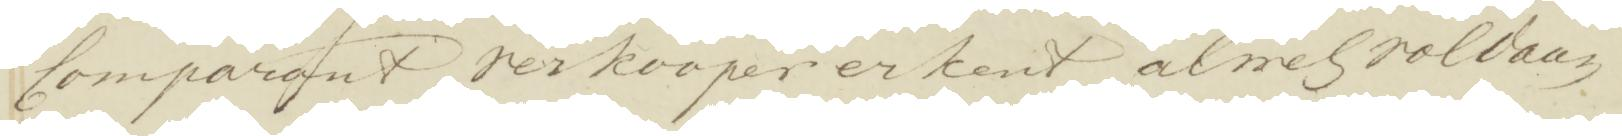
Comparant verkooper erkent alwel voldaan
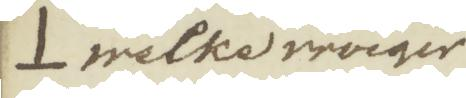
¶ welke vroeger
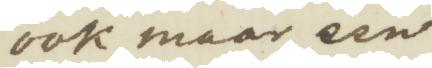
ook maar een
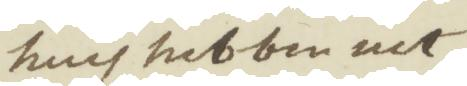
huis hebben uit
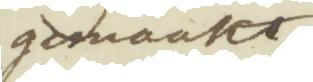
gemaakt,
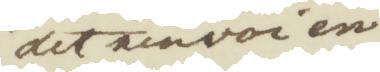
dit renvoi en
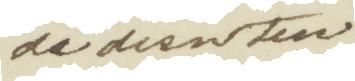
de diensten
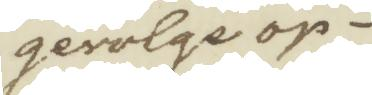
gevolge op-
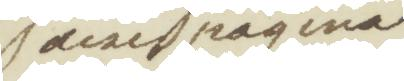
deze pagina
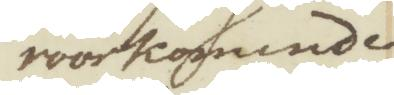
voorkomende
